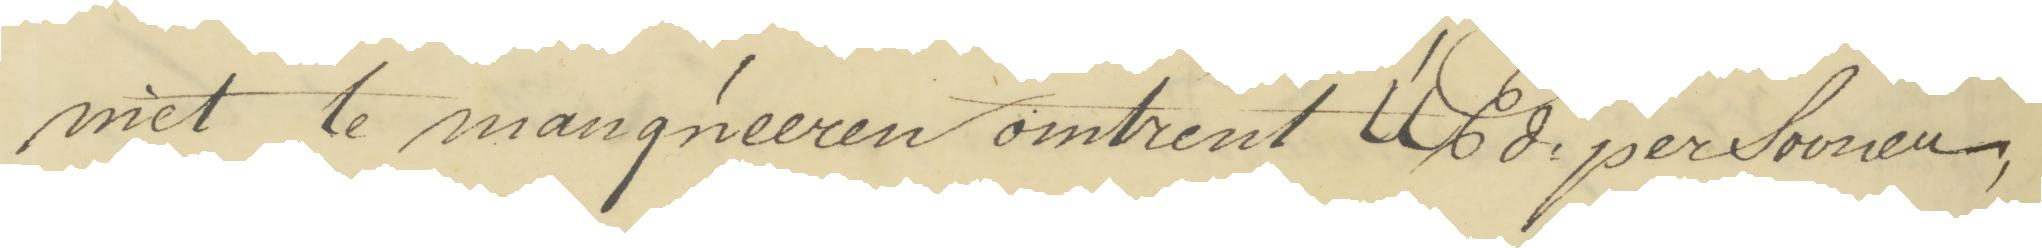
niet te manqueeren omtrent UEd: persoonen,
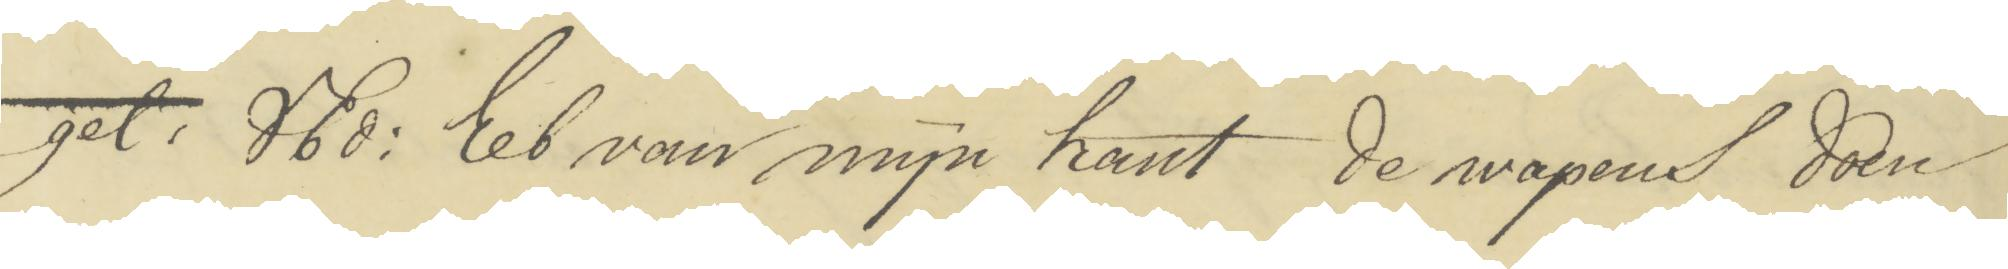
gel: VEd: heb van mijn hant de wapens doen
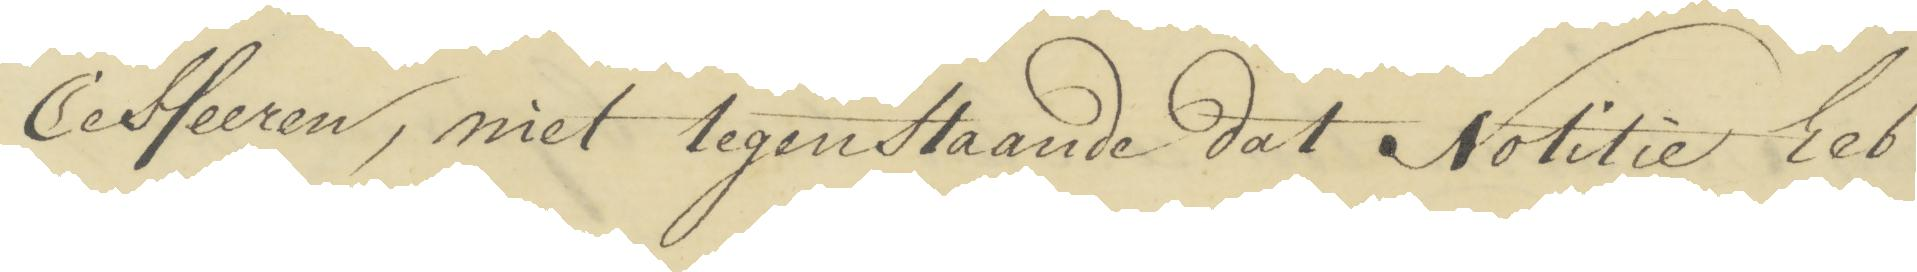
Cesseeren, niet tegenstaande dat Notitie heb
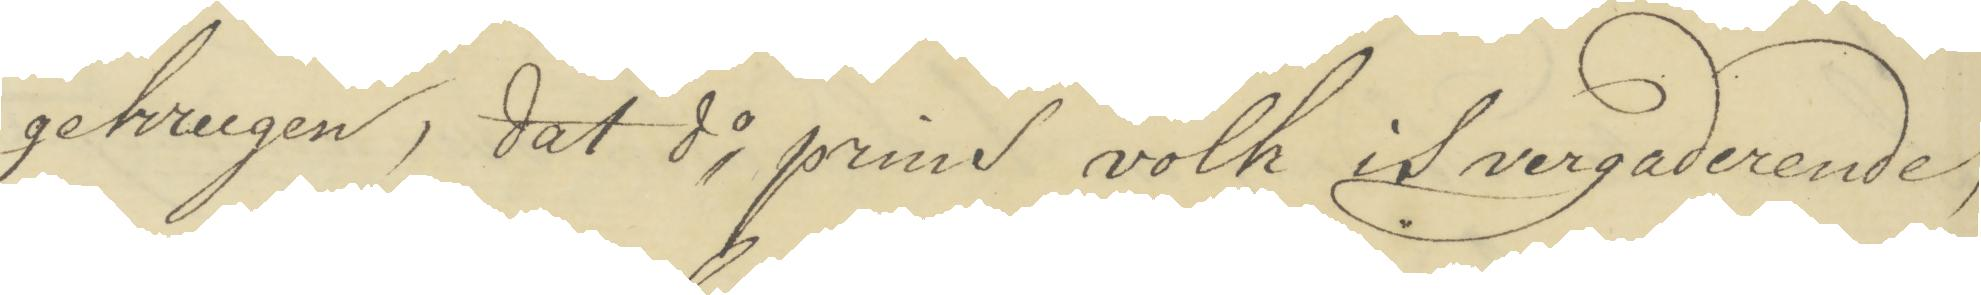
gekreegen, dat d„o prins volk is vergaderende,
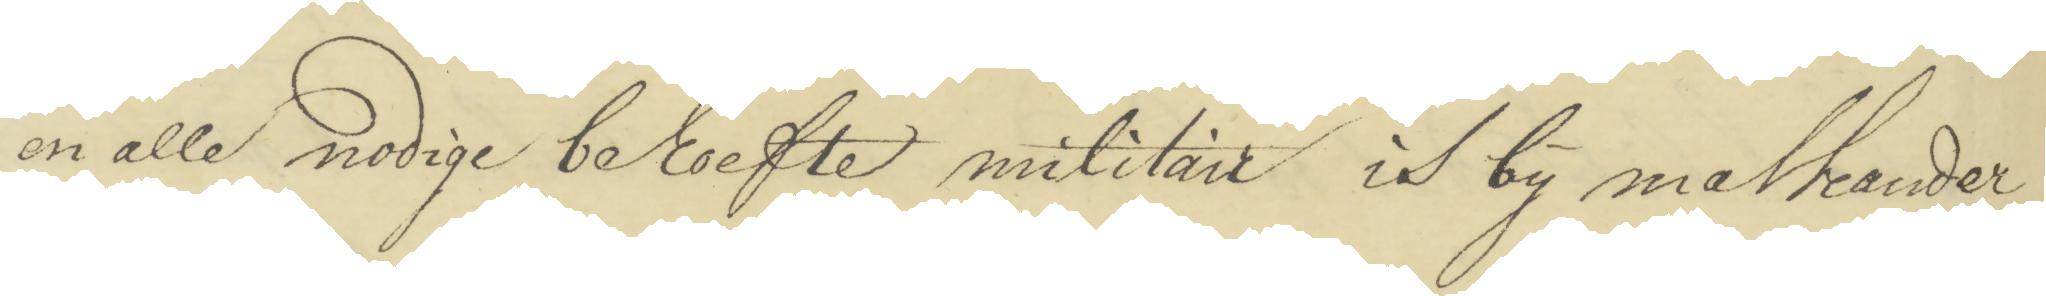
en alle nodige behoefte militair is bij malkander
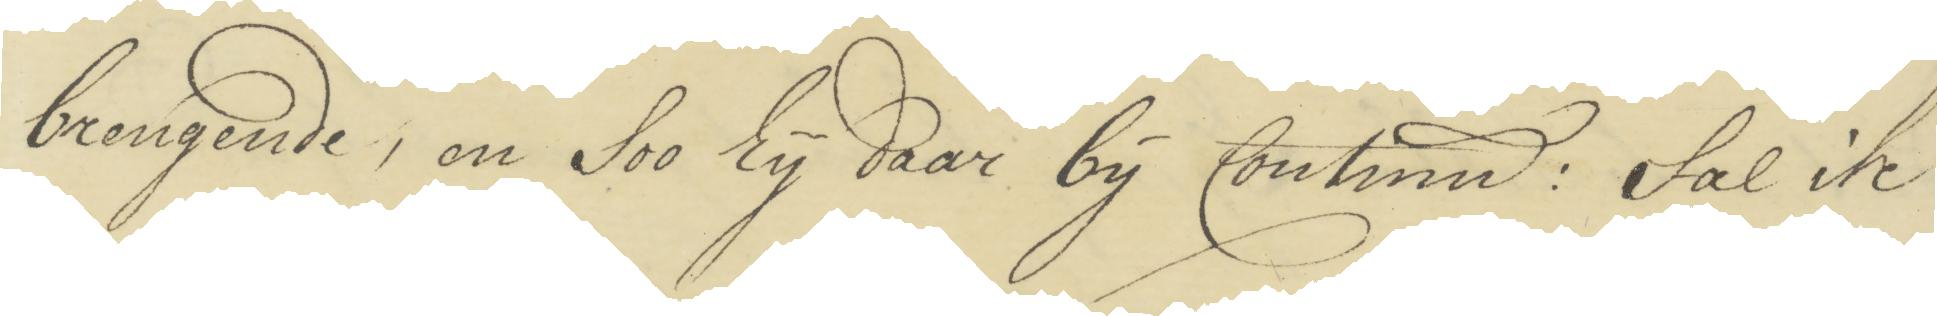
brengende; en soo hij daar bij Continu: sal ik
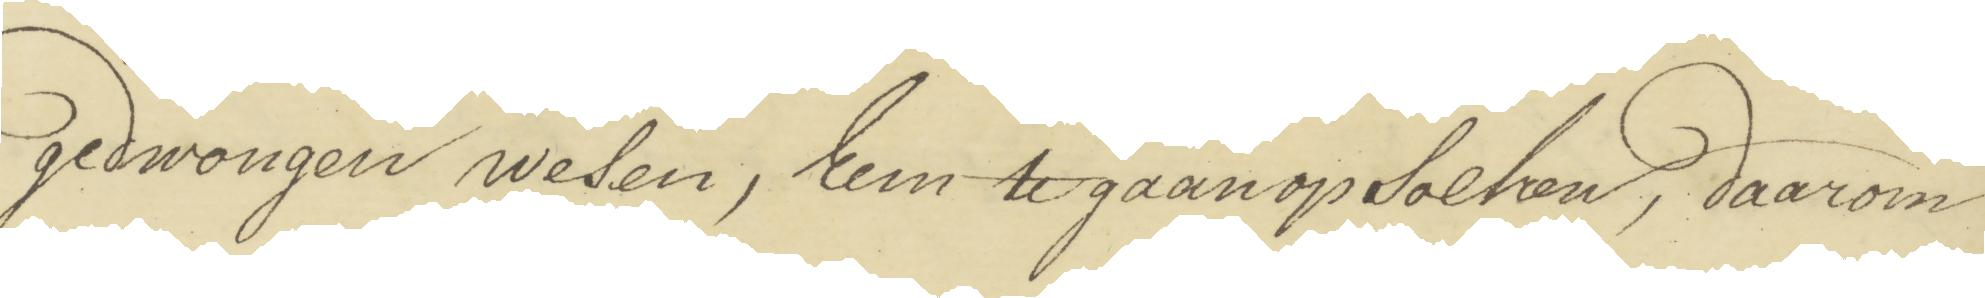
gedwongen wesen, hem te gaan opsoeken, daarom
